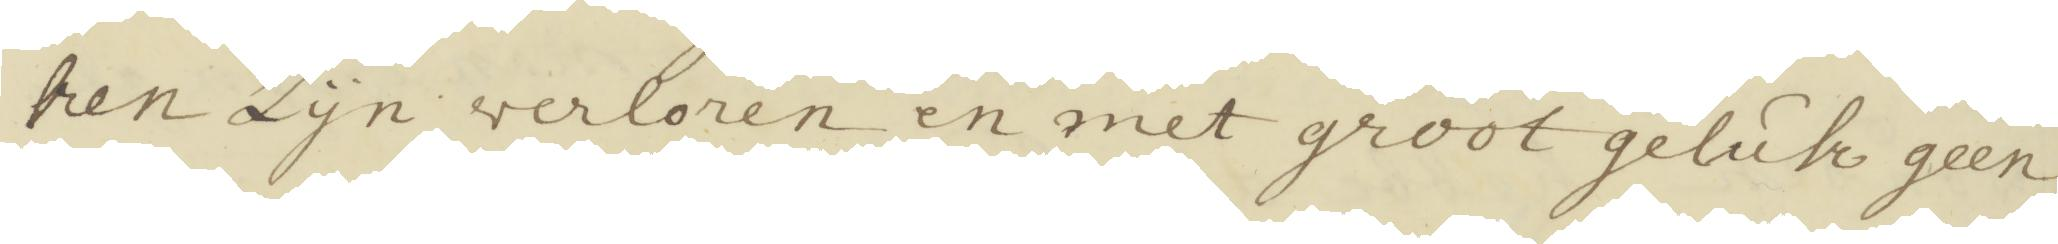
ken Zijn verloren en met groot geluk geen
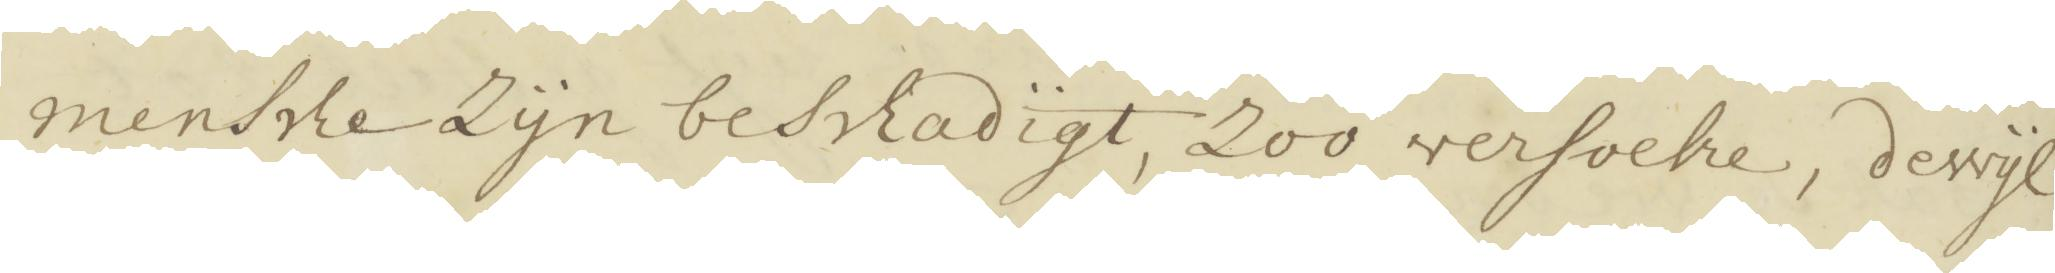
mensche Zijn beschadigt, Zoo versoeke, dewijl
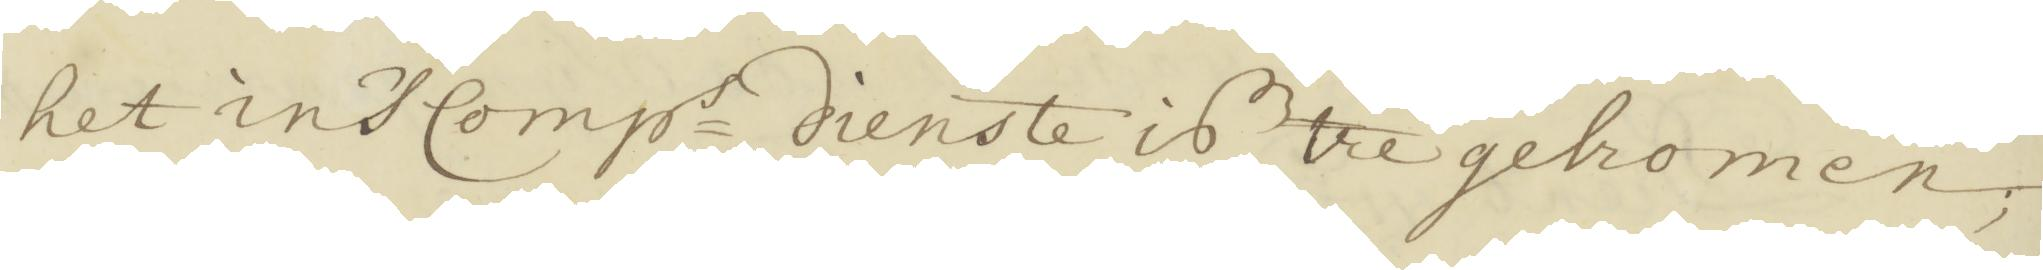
het in 'S Comp=s dienste is tre gekomen;
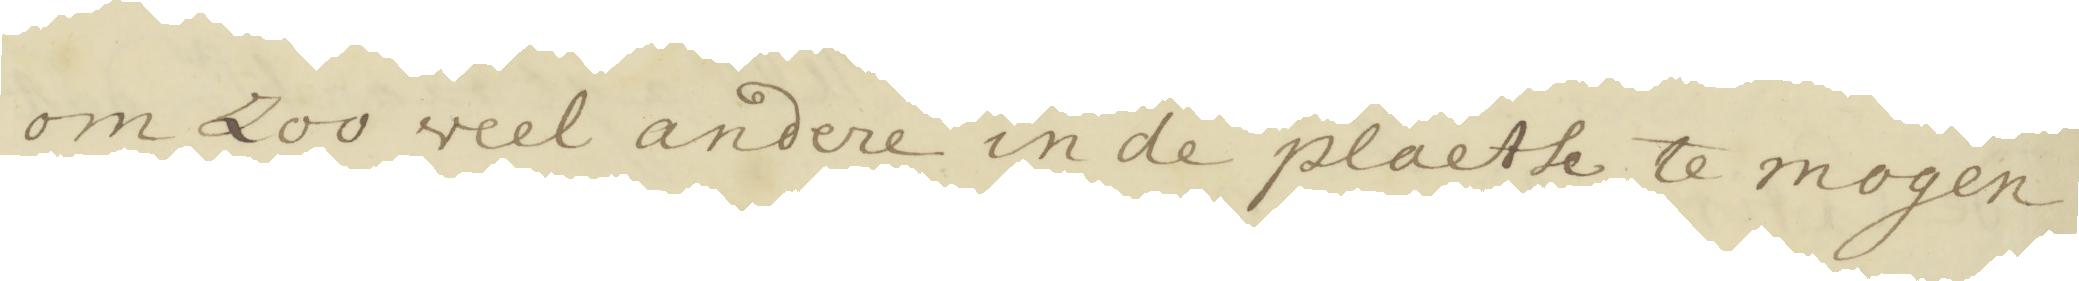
om zoo veel andere in de plaetse te mogen
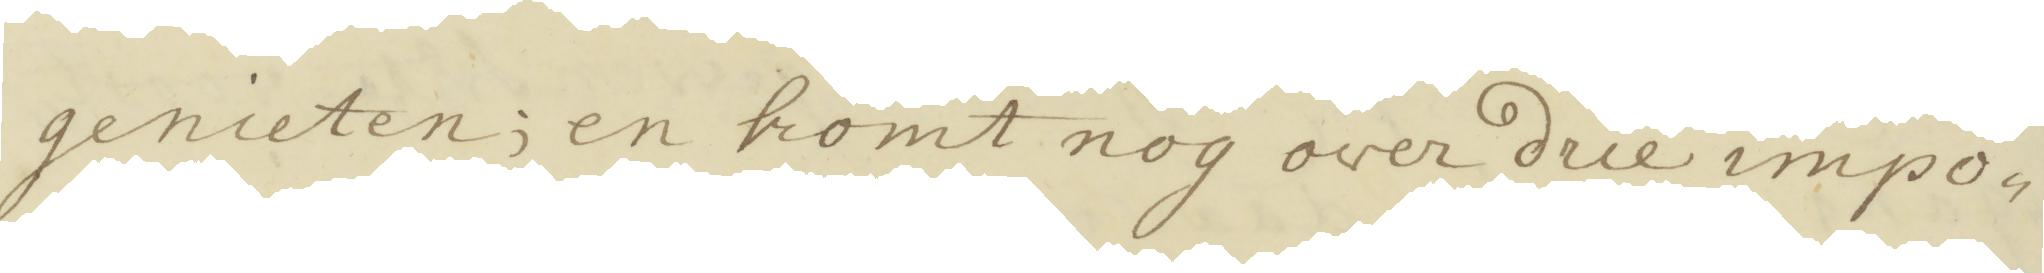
genieten; en komt nog over drie impo„
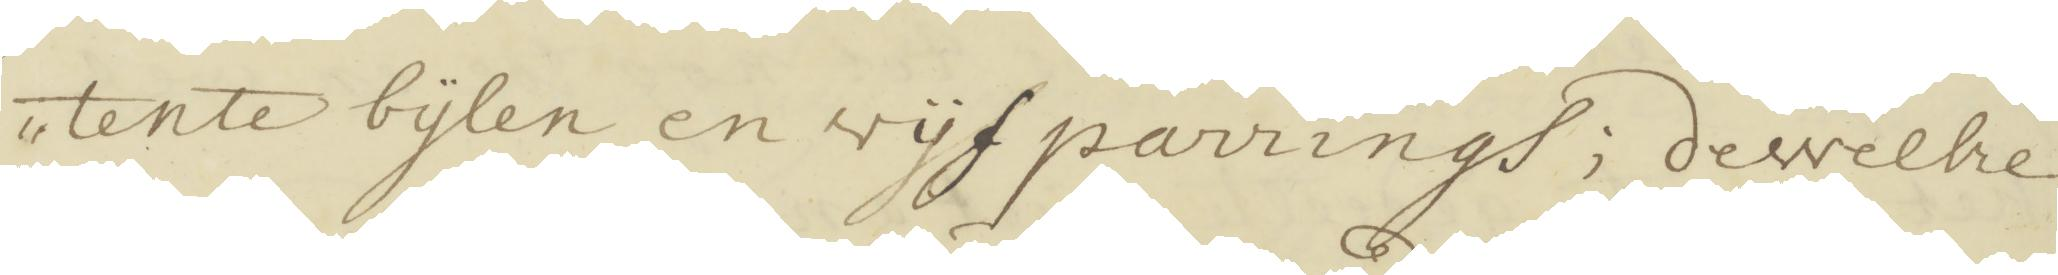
„tente bijlen en vijf parrings; dewelke
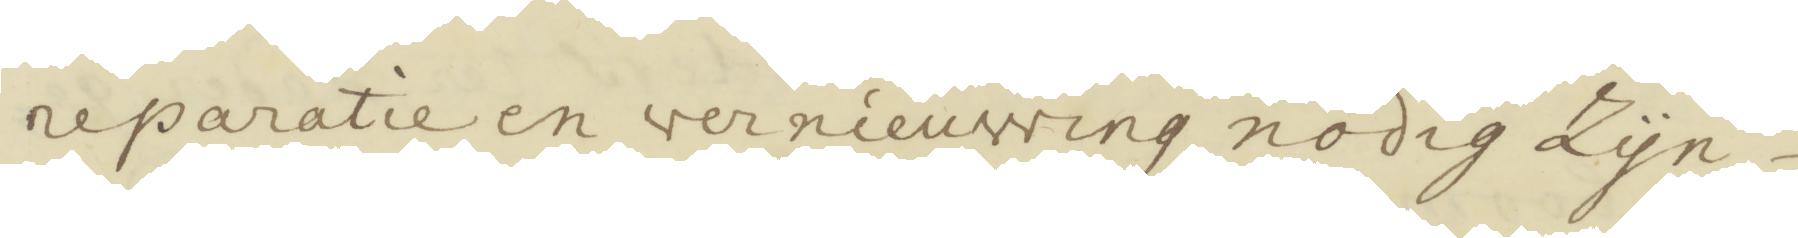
reparatie en vernieuwing nodig Zijn
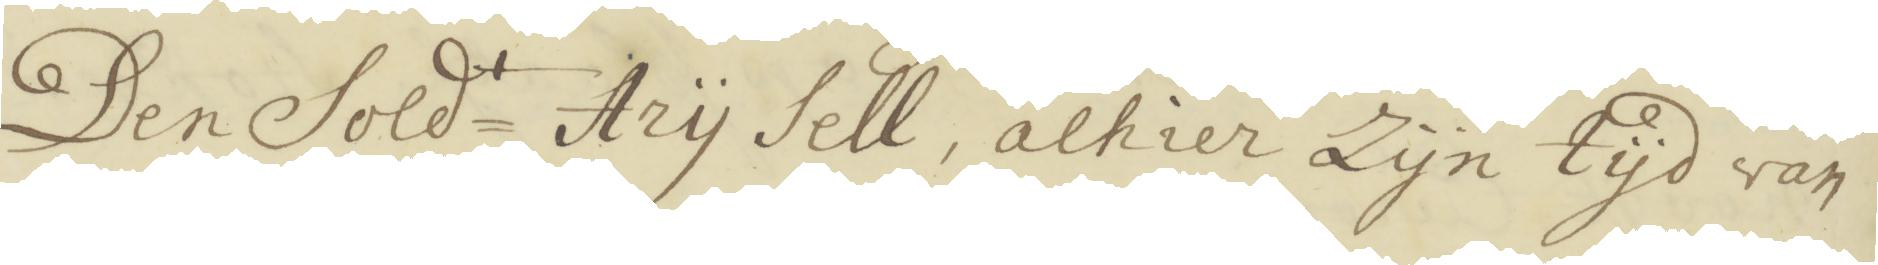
Den Sold=t Arij Sell, alhier Zijn tijd van
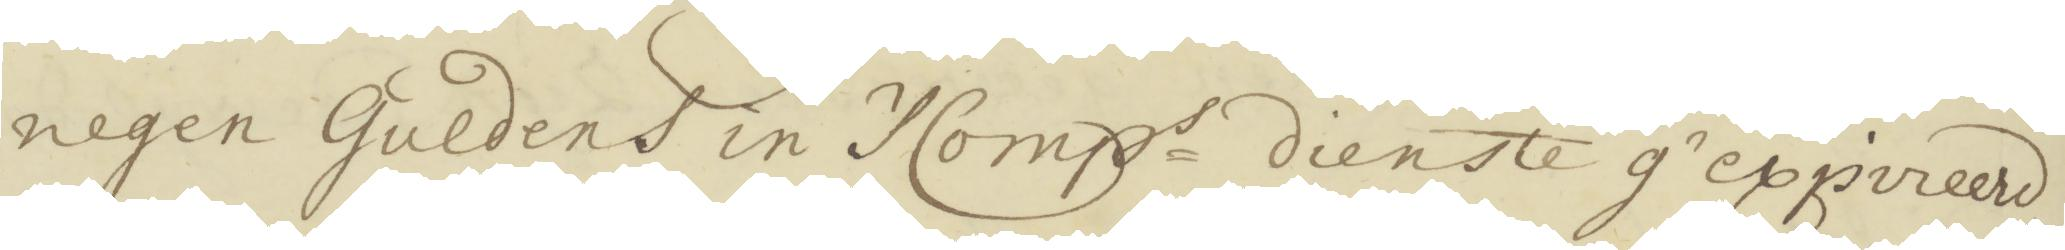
negen Guldens in ’s Comp=s dienste g’expireerd
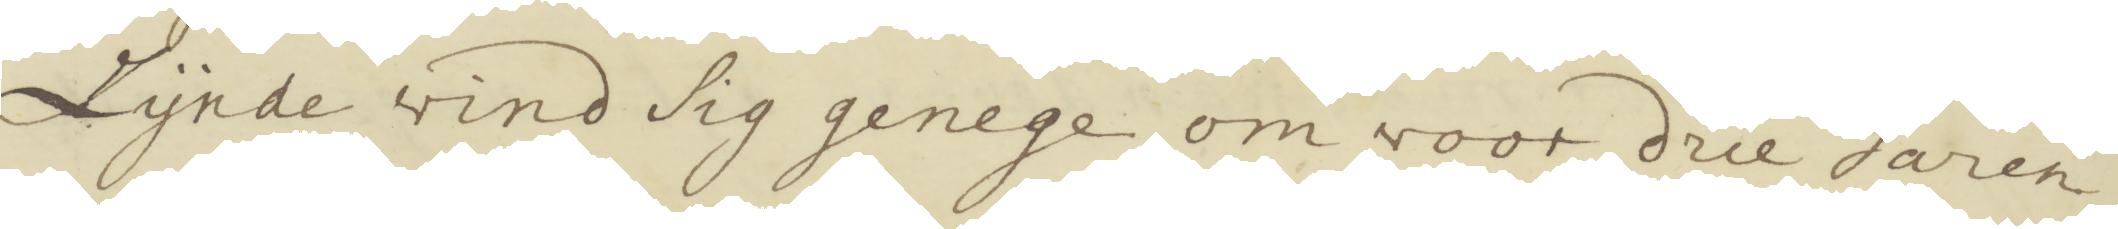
Zijnde vind Sig genege om voor drie Iaren
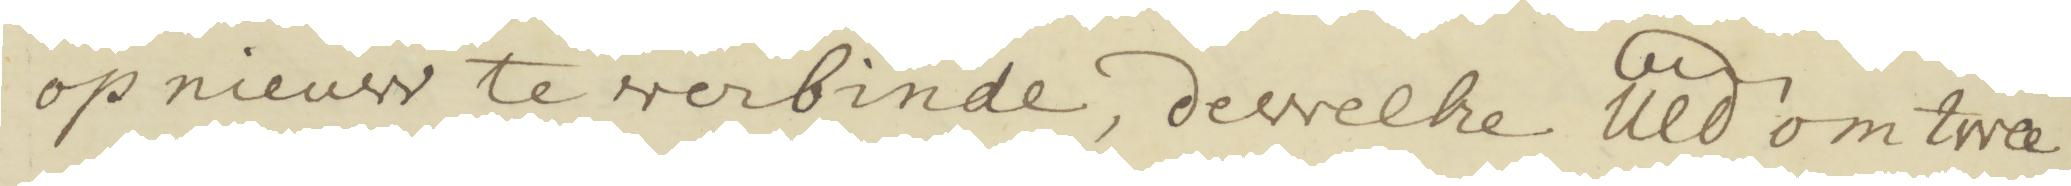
op nieuw te verbinde, dewelke ued om twee
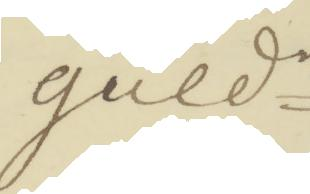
guld=ns
